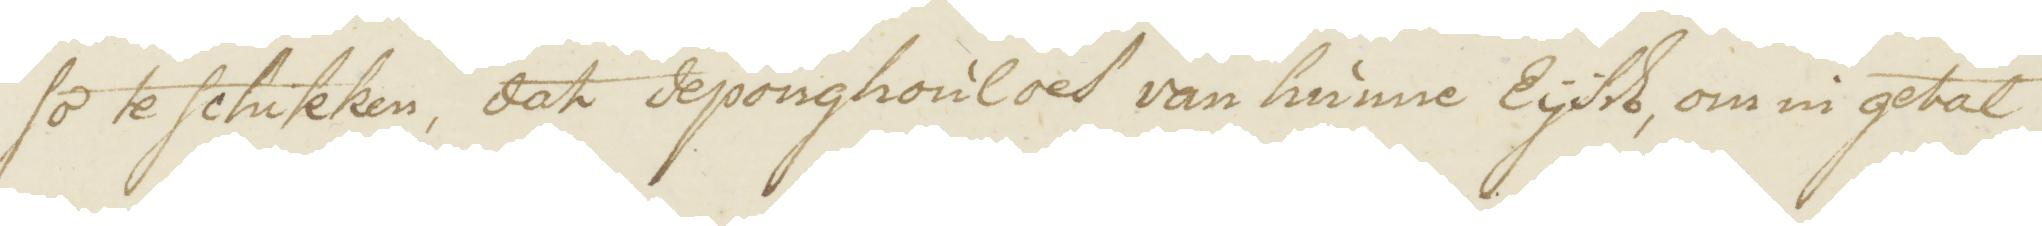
so te schikken, dat deponghouloes van hunne Eijsch, om in getal
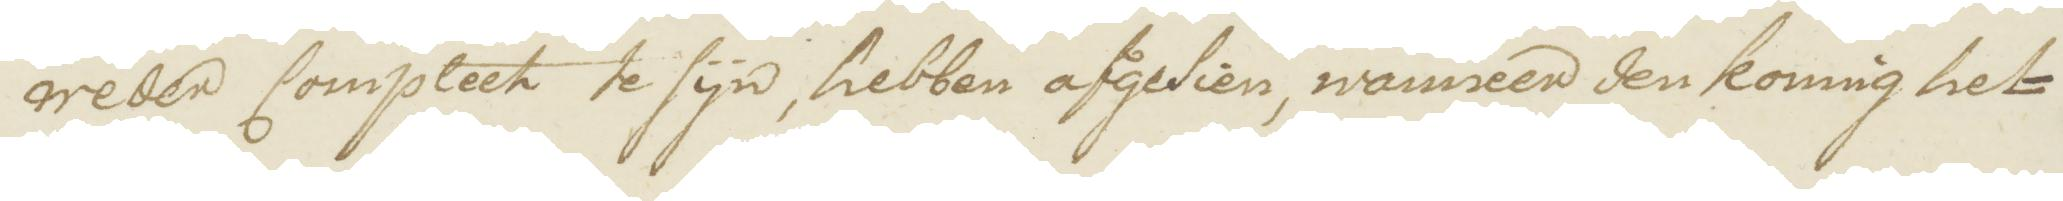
weder compleet te sijn, hebben afgesien, wanneer den koning het
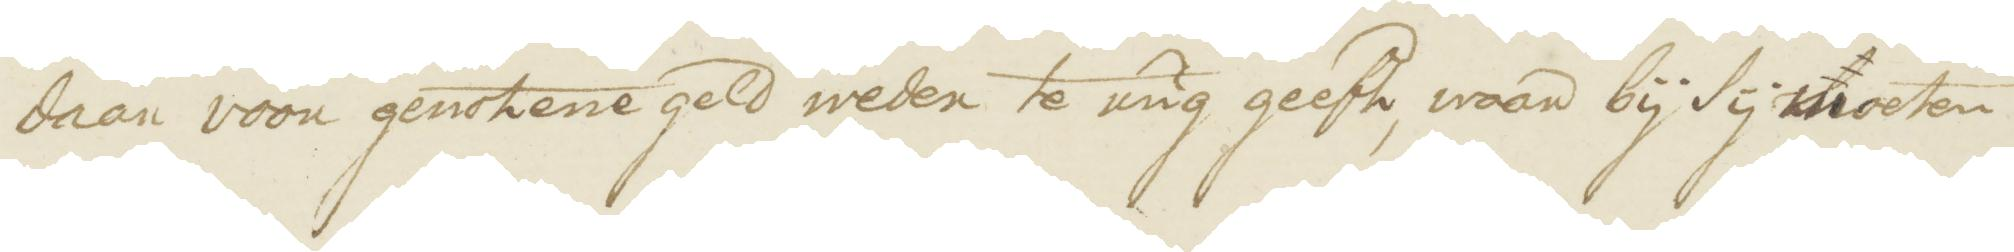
daar voor genotene geld weder te rug geeft, waar bij sij moeten
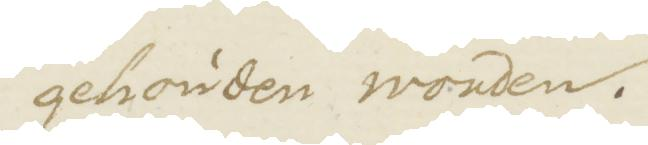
gehouden worden.
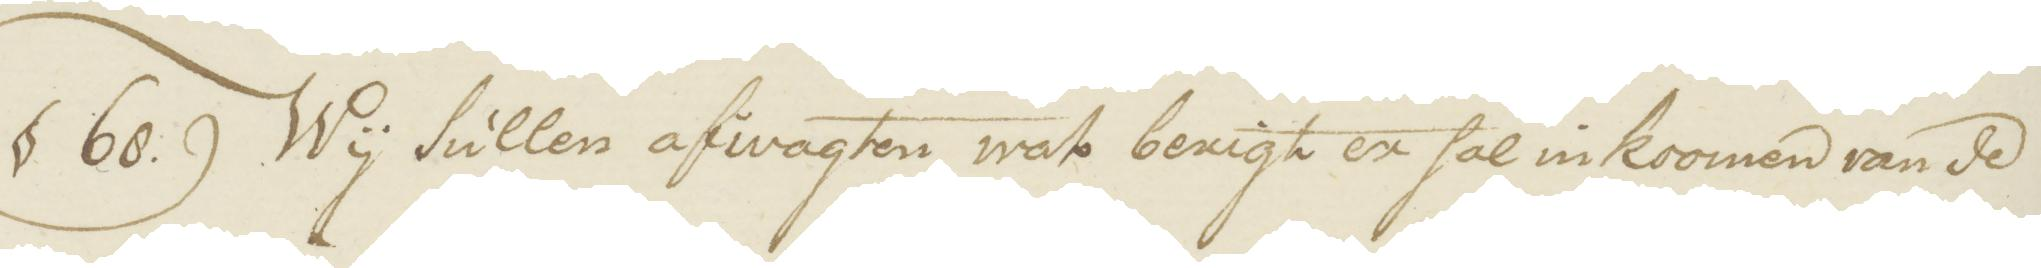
§ 68. Wij sullen afwagten wat berigt er sal inkoomen van de
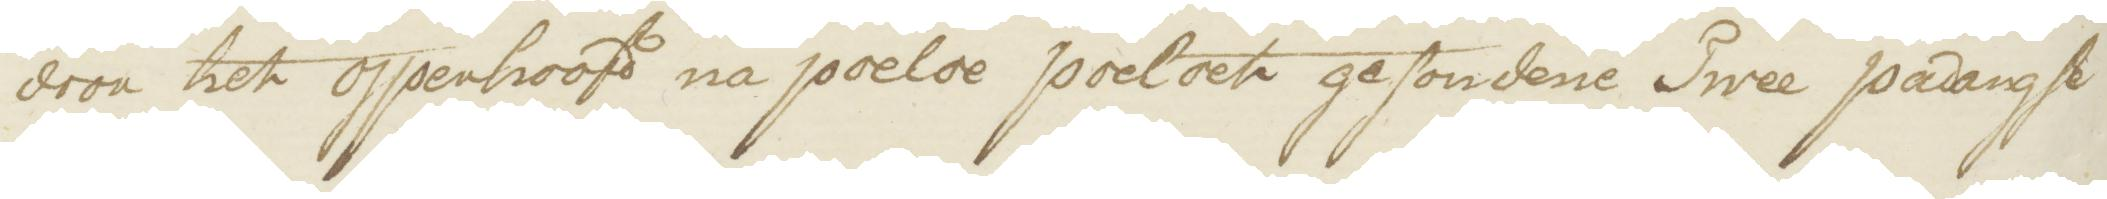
door het opperhoofd na poeloe poeloek gesondene twee padangse
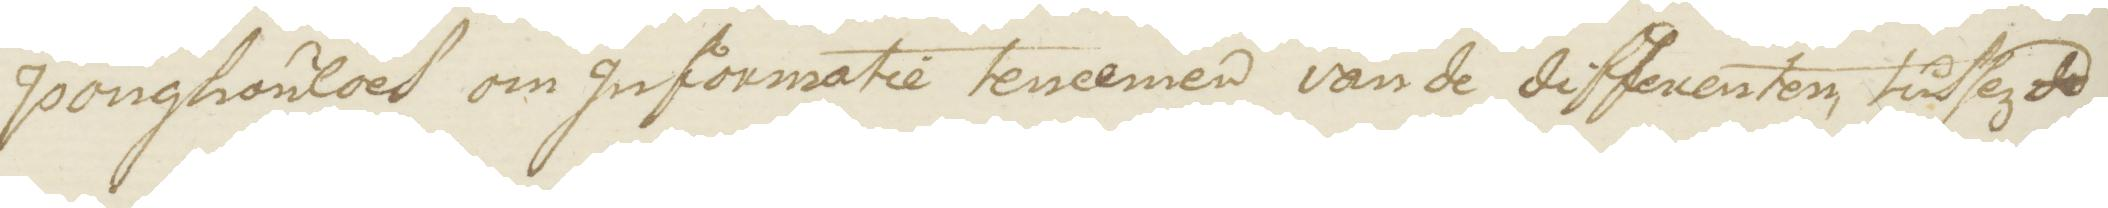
ponghouloes om Informatie teneemen van de differenten tussen de
